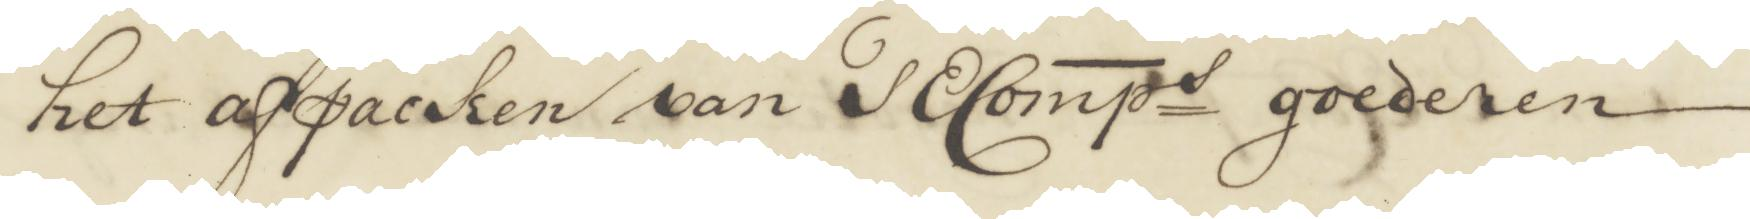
het afpacken van 's EComp=s goederen
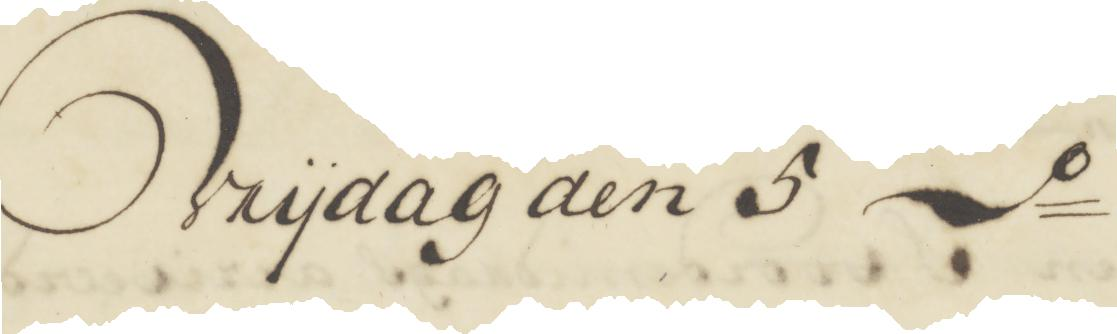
Vrijdag den 5 D=o
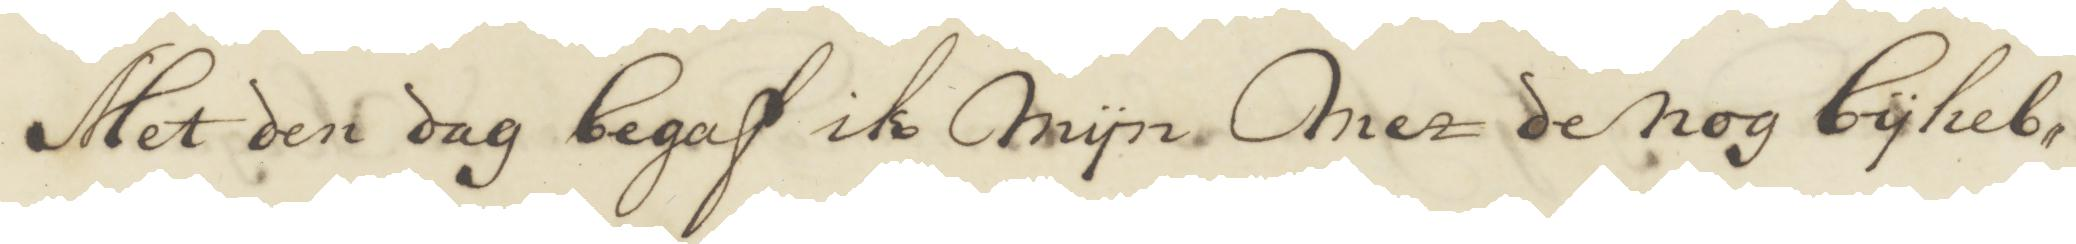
Met den dag begaf ik Mijn, Met de nog bij heb„
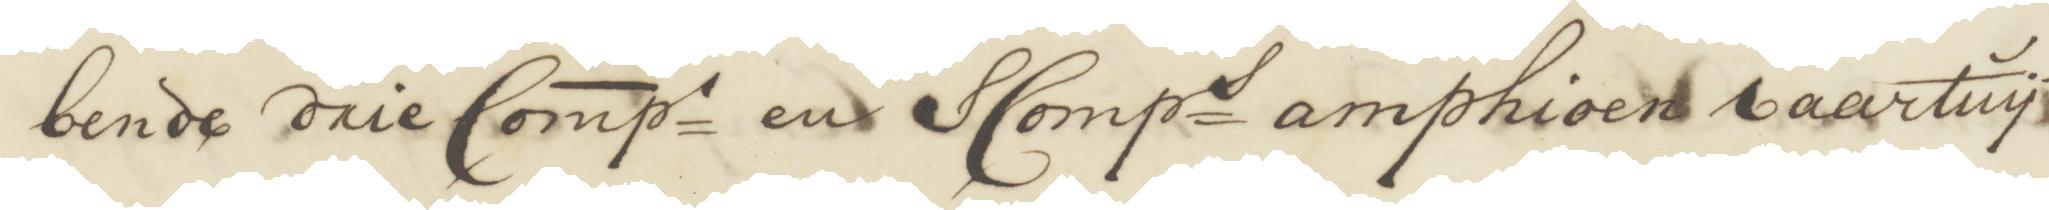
bende drie Comp=s en sComp=s amphioen vaartuij
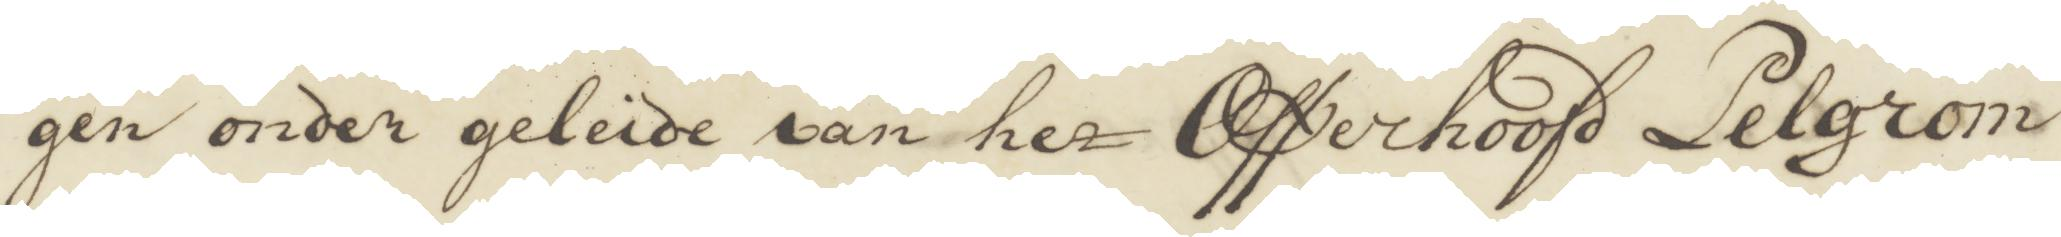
gen onder geleide van het Opperhoofd Pelgrom
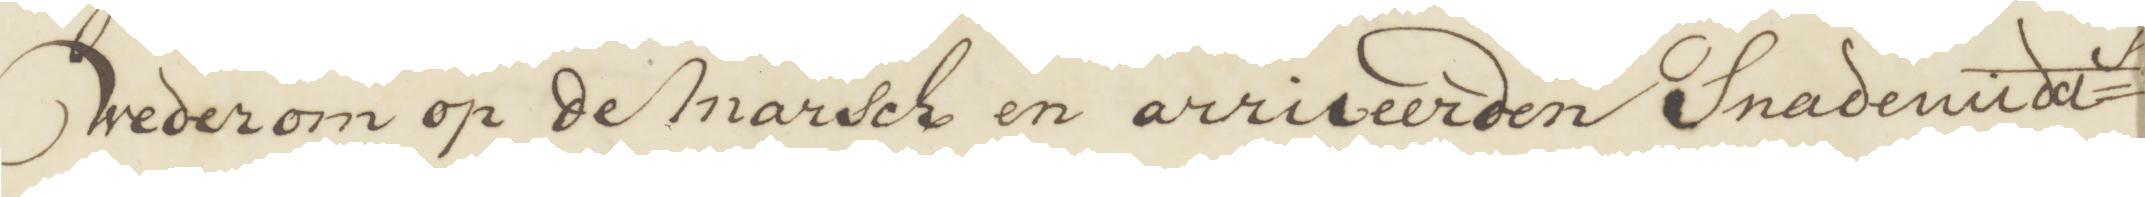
Wederom op de Marsch en arriveerden snadenuda=s
